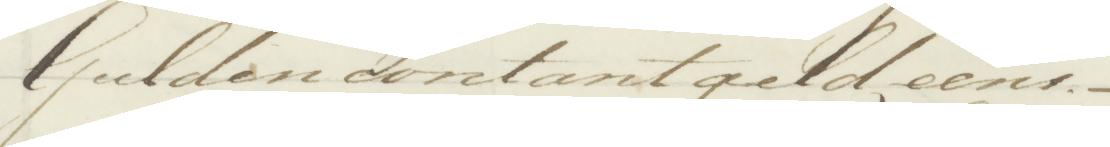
Gulden contant geld eens.
